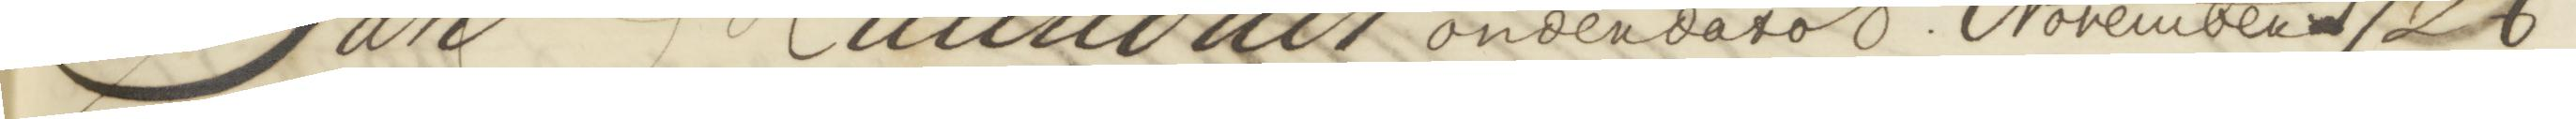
Van Mallabaer onder dato 8.' November 1726
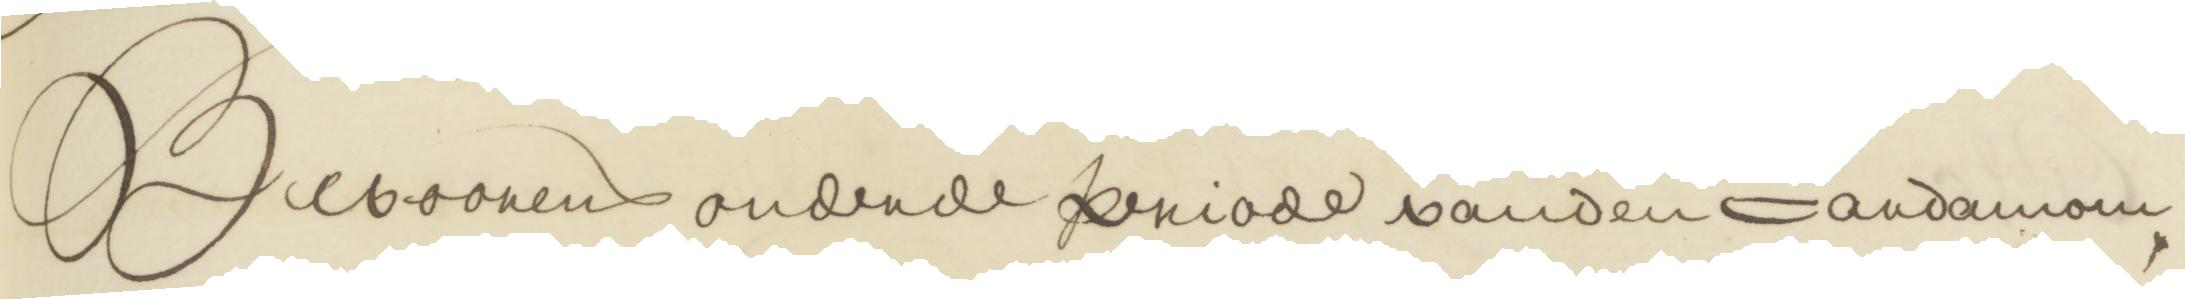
Bevoorens onder de periode van den cardamom
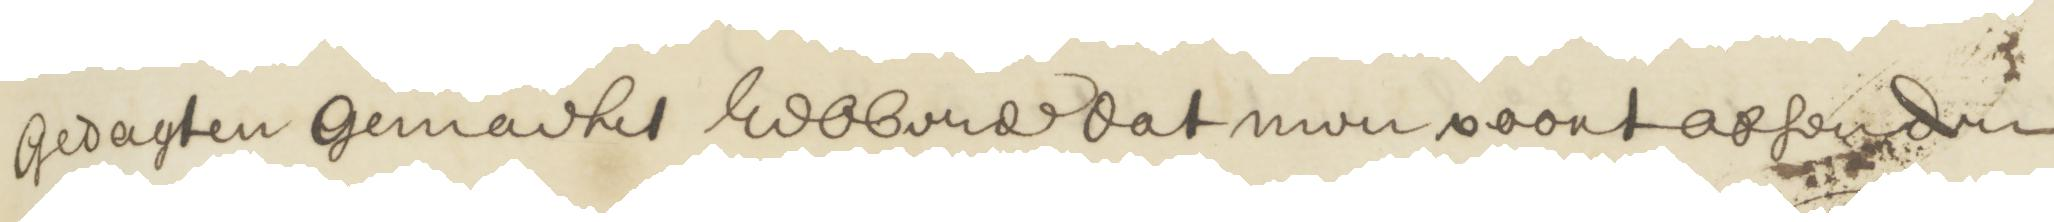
gedagten gemaekt hebbende dat men voort afsenden
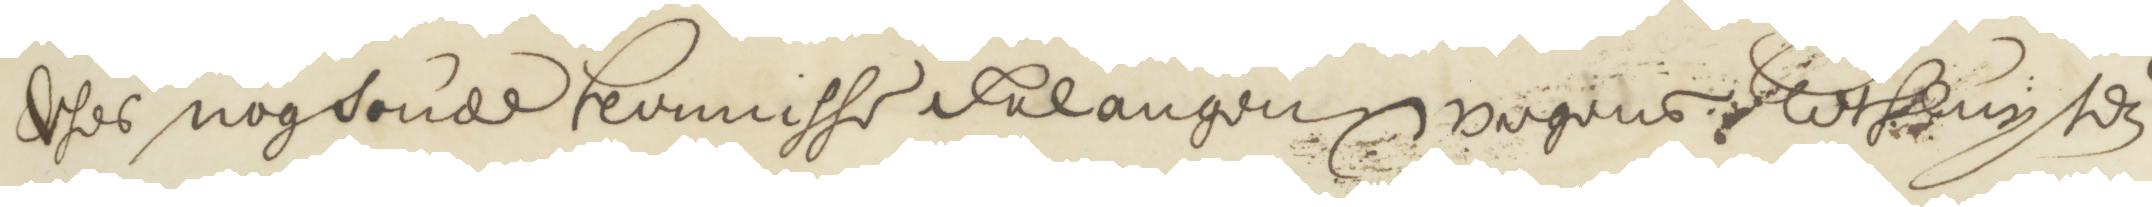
deses nog soude kennisse Erlangen wegens het sluijten
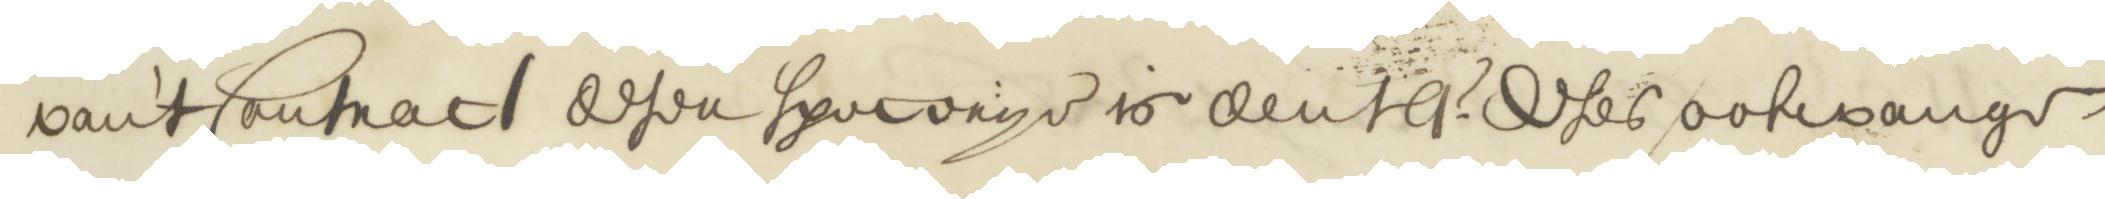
van ’t Contract deser specerije is den 14.e deses ook vange
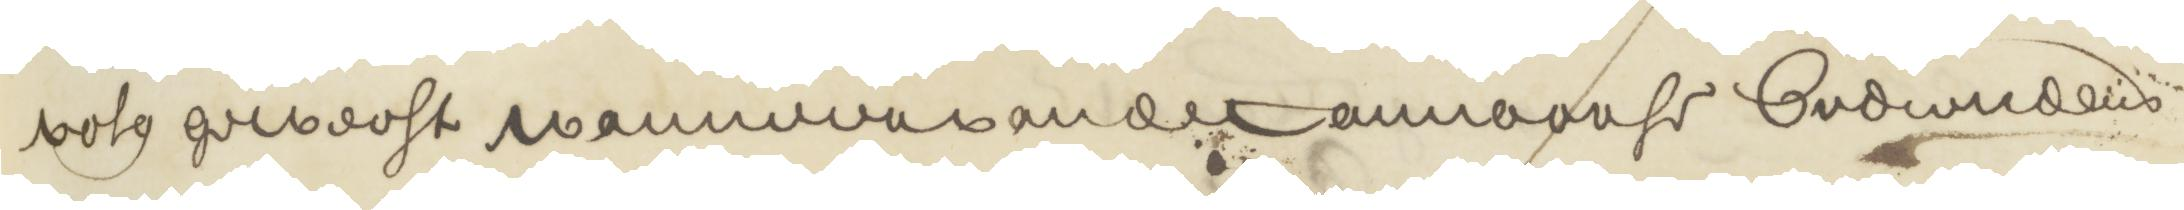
volg geweest wanneer van de cannoorse bediendens
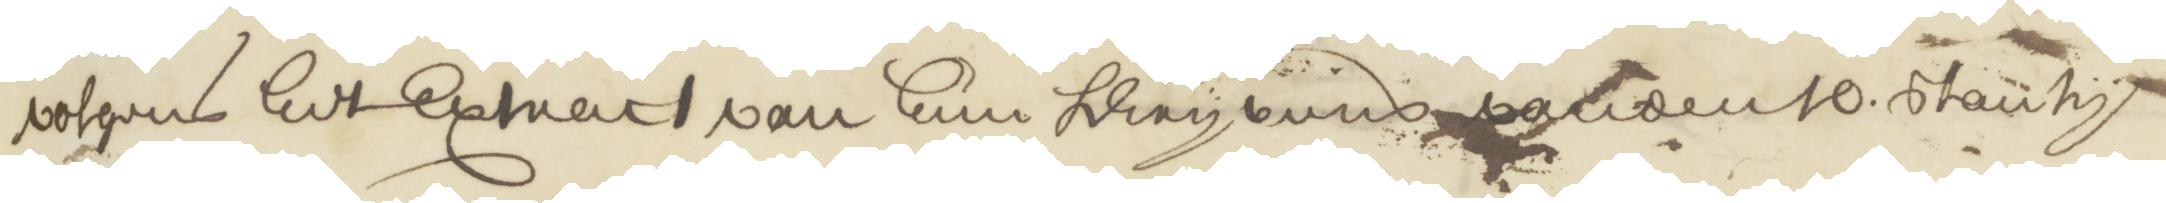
volgens het Extract van hun schrijvens van den 10. stantij
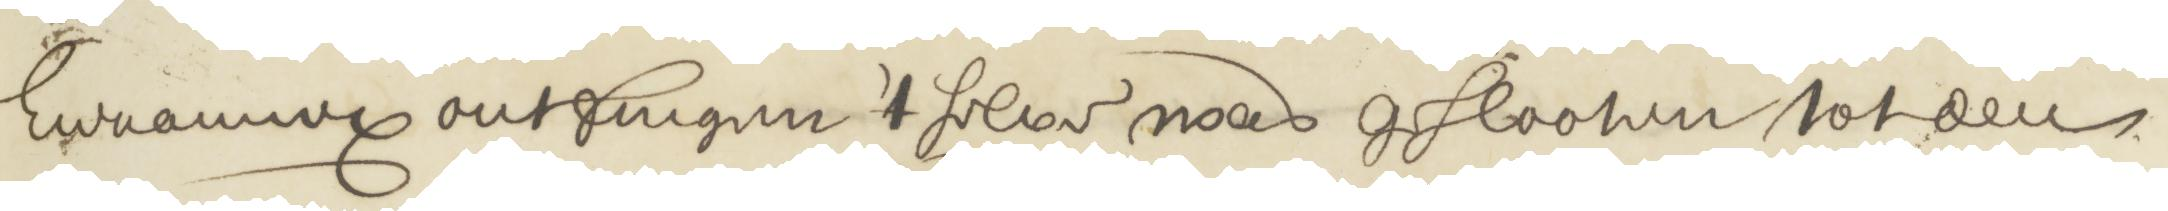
hier annex ontfangen ’t selve was geslooten tot den
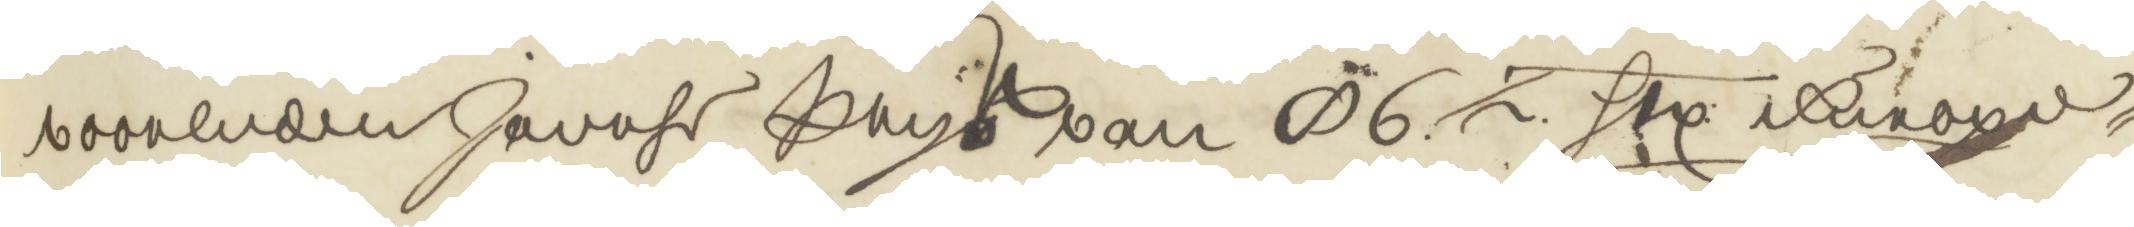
voorleden jaerse prijs van 86.½. stx: Europe„
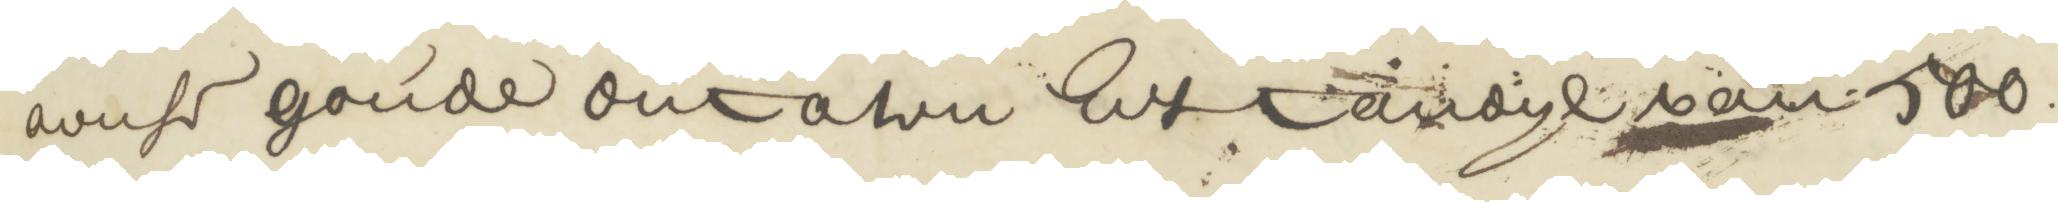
aense goude ducaten het candijl van 500
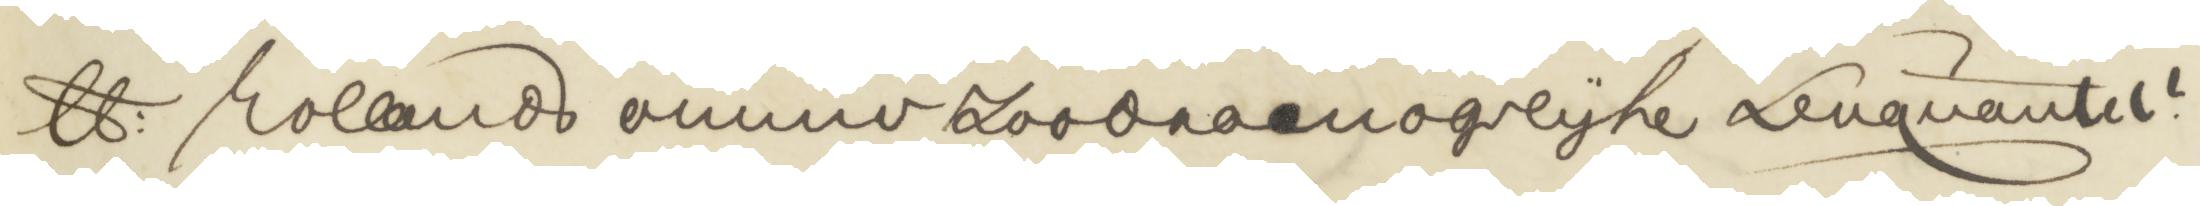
lb: hollands omme zoodra mogelijke ter quantit.t
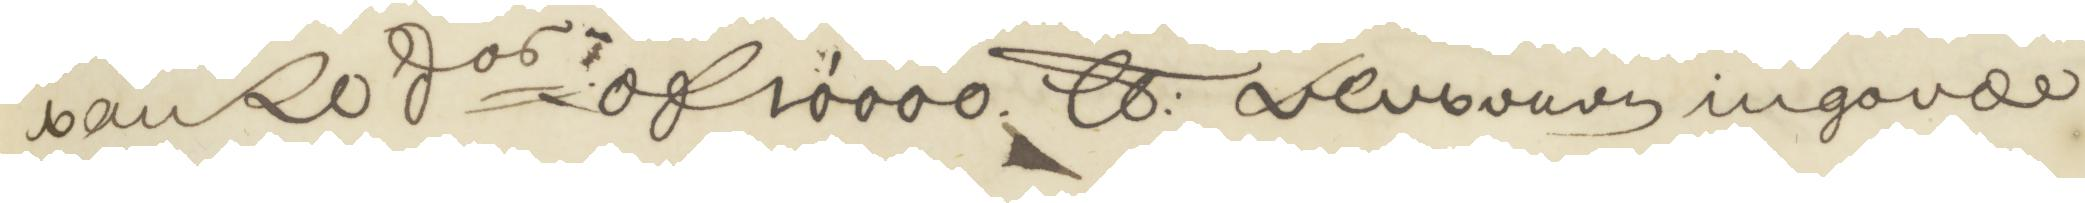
van 20 d=os of 10'000. lb: televeren in goede
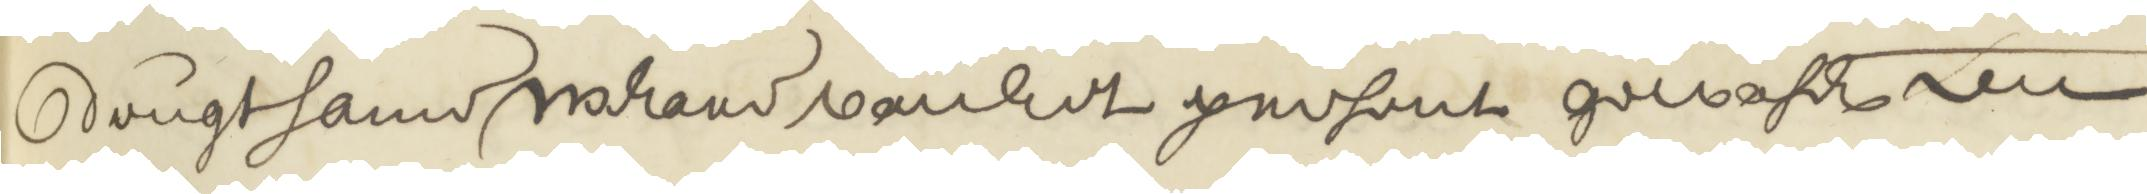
deugtsame whare van het present gewasch ten
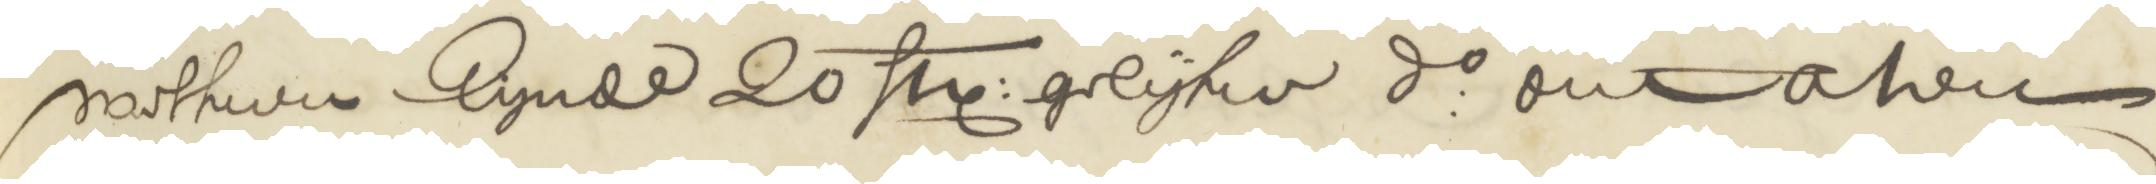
welken Eijnde 20 stx: gelijke d:o ducaten
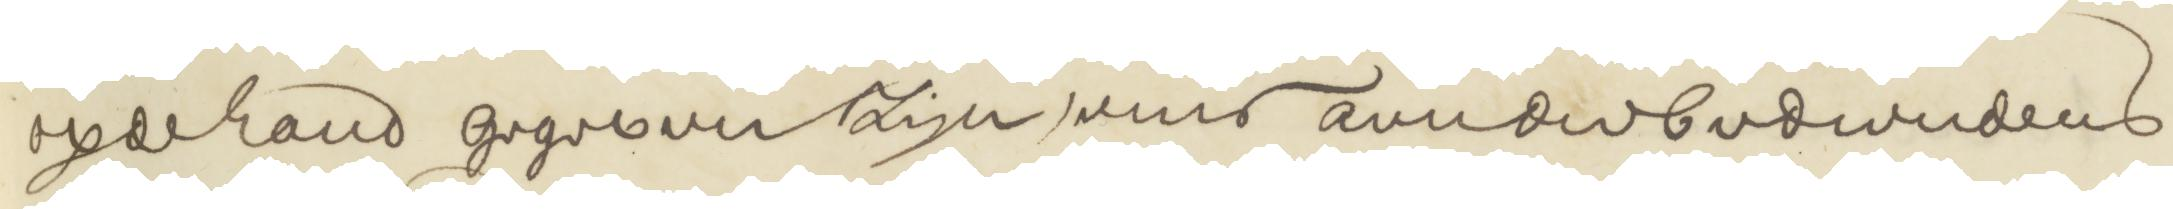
op de hand gegeven zijn, en is aan die bediendens
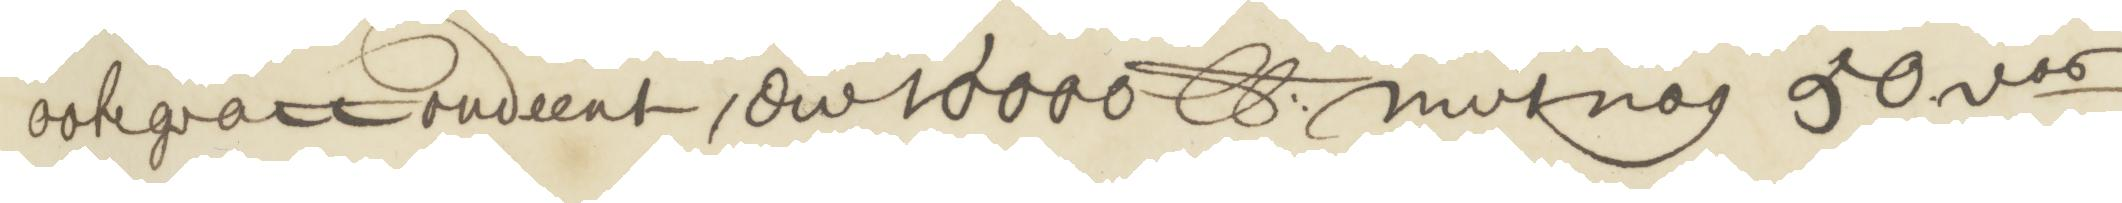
ook geaccordeert, die 10'000 lb: met nog 50. d—os
